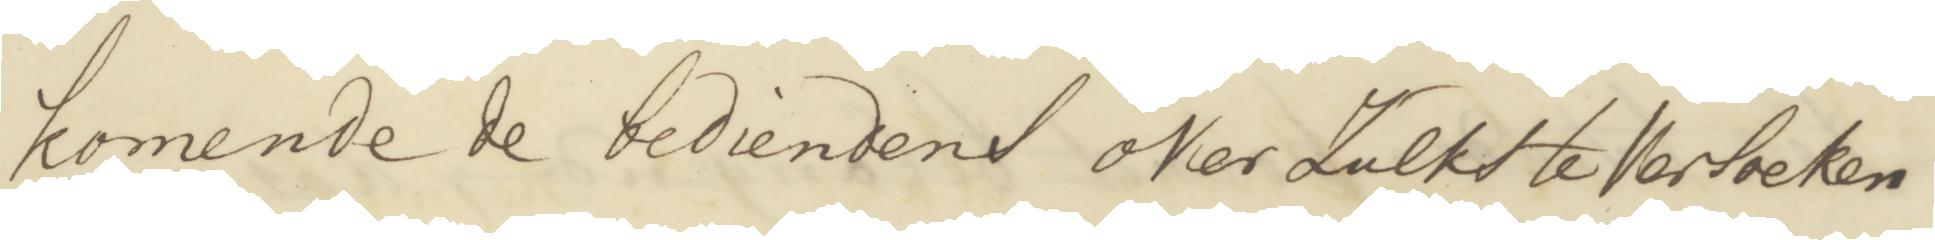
komende de bediendens over zulks te versoeken
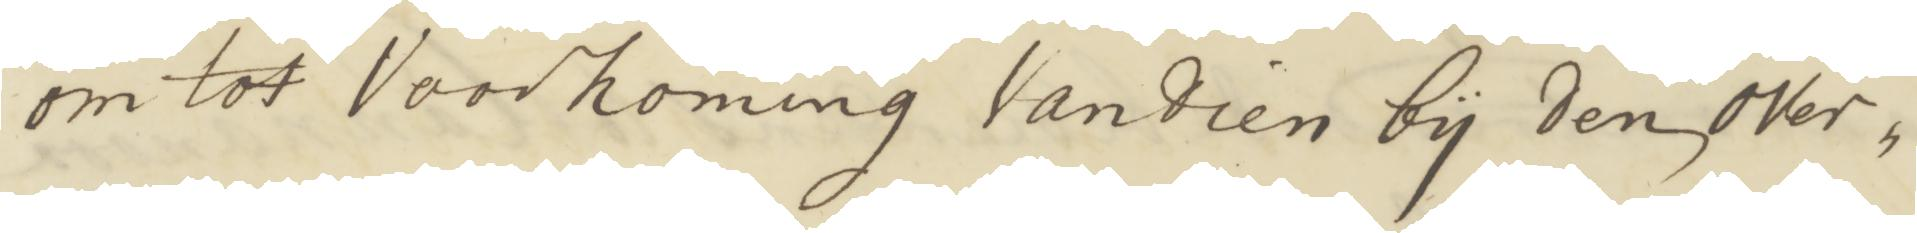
om tot voorkoming vandien bij den over„
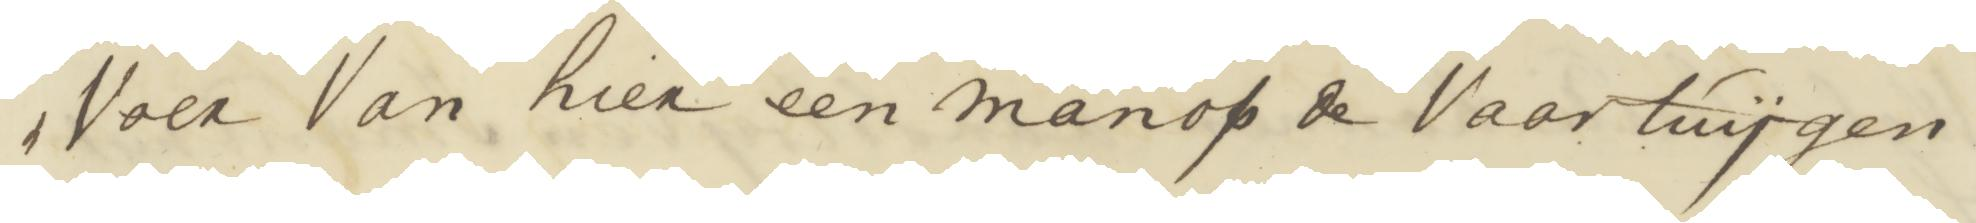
„voer van hier een manop de vaartuijgen
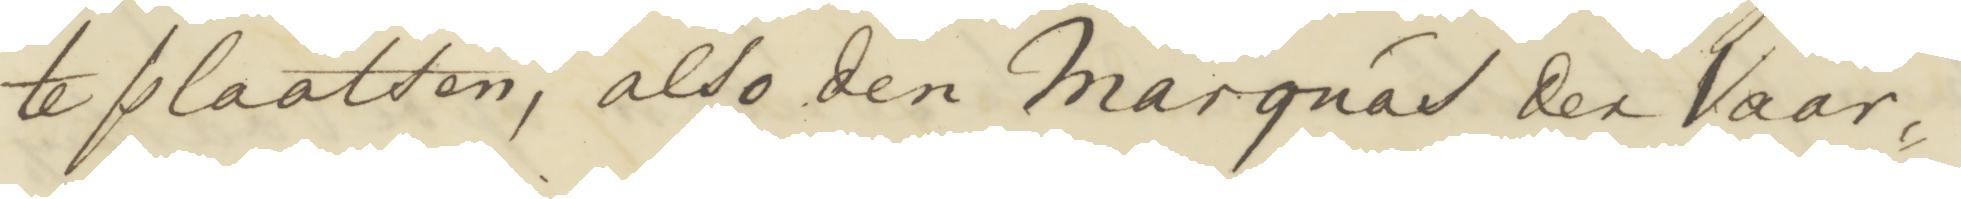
te plaatsen, also den marquas der vaar„
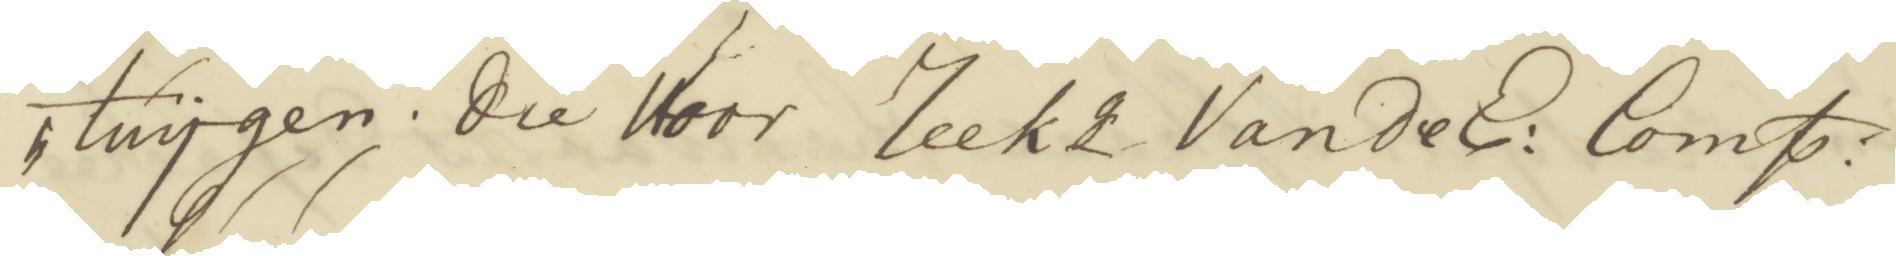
„tuijgen. die voor reek-g van de E: Comp:
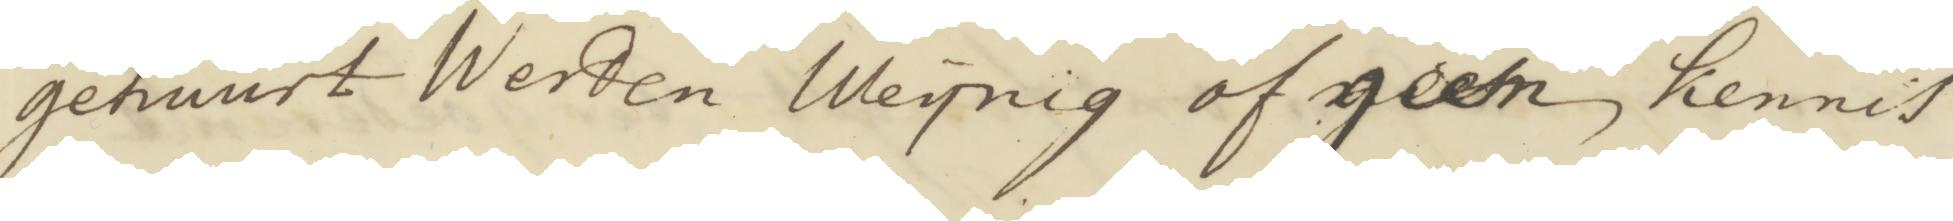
gehuurt werden weijnig of geen kennis
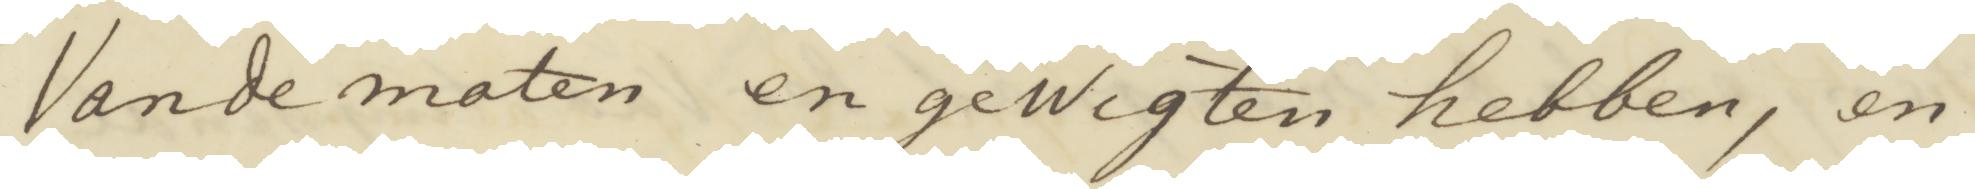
van de maten en gewigten hebben, en
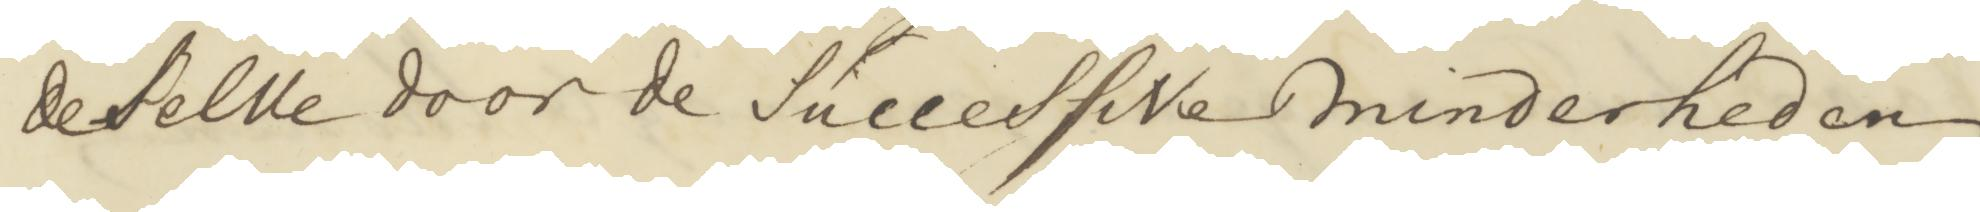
deselve door de successive minderheden
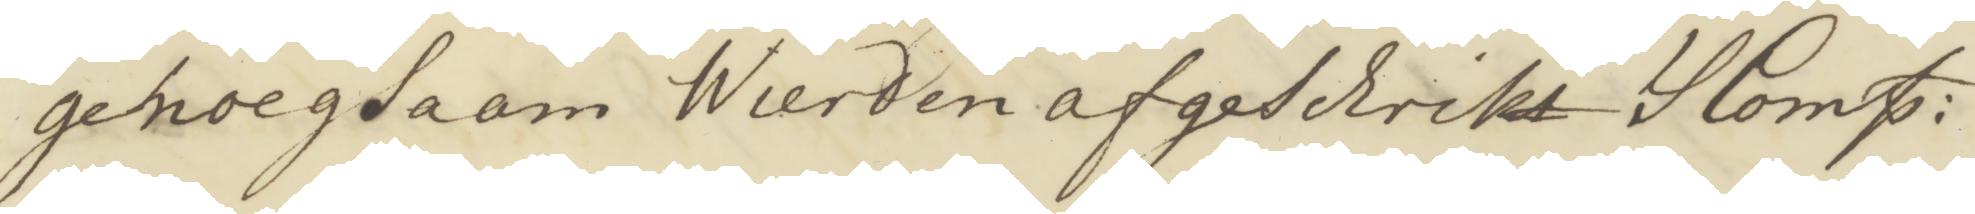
genoegsaam wierden afgeschrikt ’s Comp:
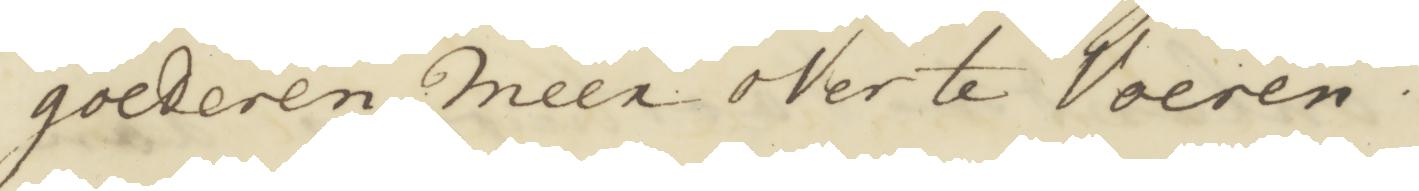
goederen meer over te voeren.
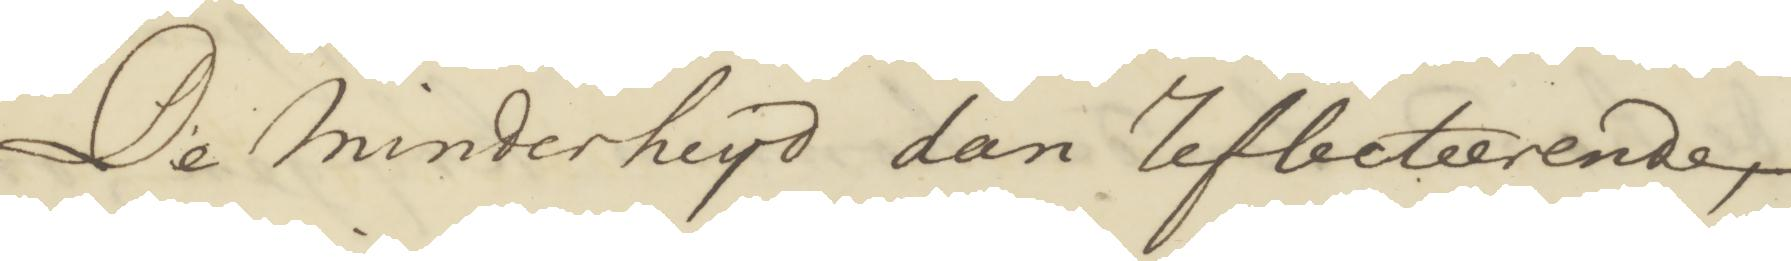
De minderheijd dan reflecteerende,
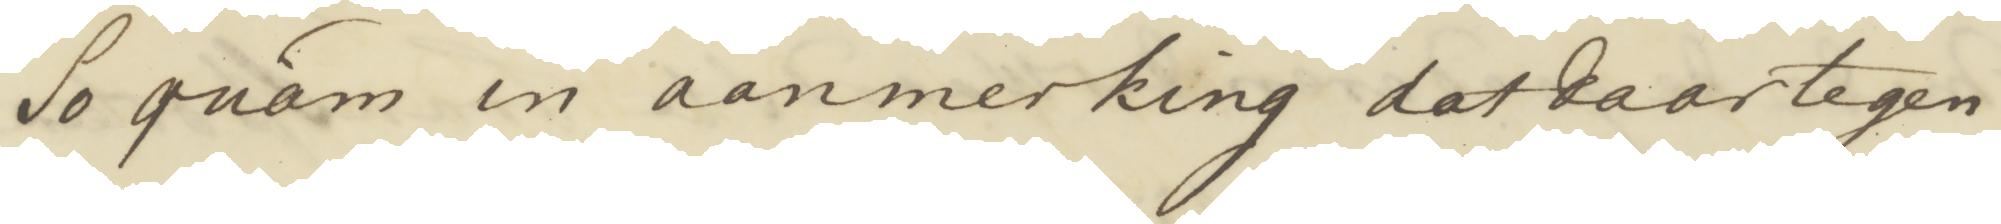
so quam in aanmerking dat daar tegen
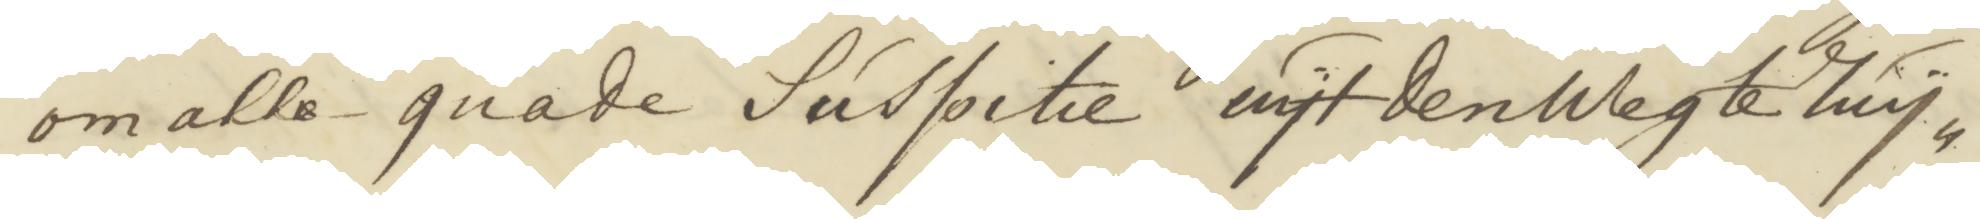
om alle quade suspitie uijt denweg te ruij„
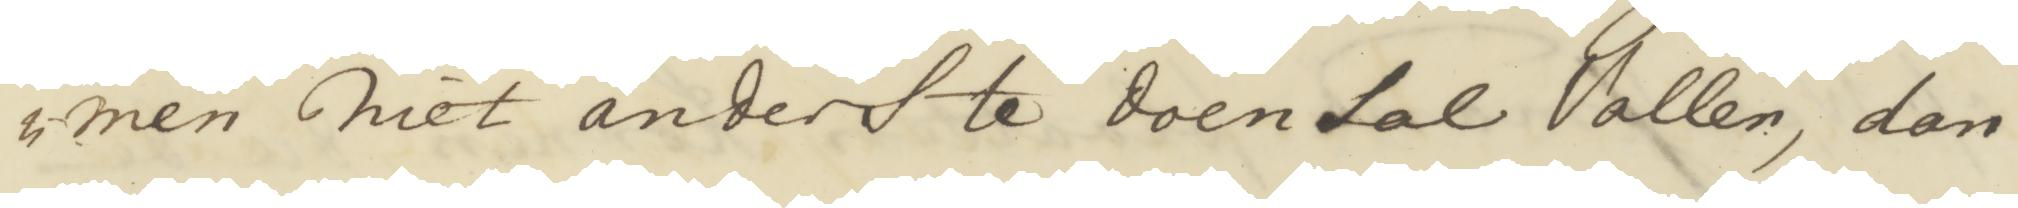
„men niet anders te doen sal vallen, dan
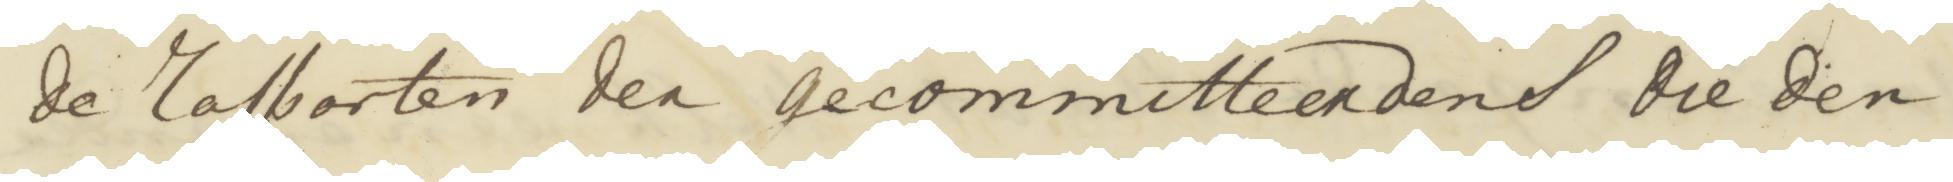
de rapporten der gecommitteerdens die den
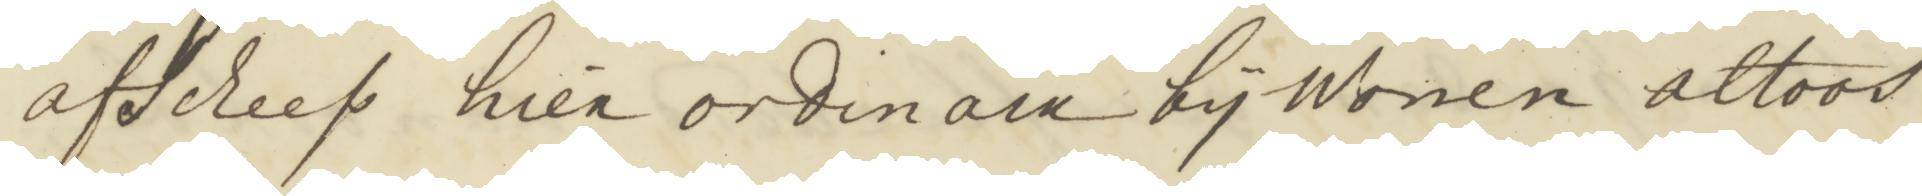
afscheep hier ordinair bijwonen altoos
